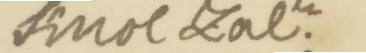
knol zal:r
